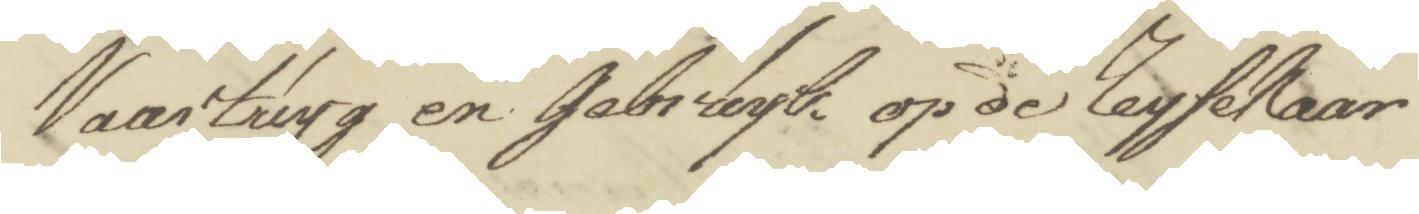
Vaartuyg en gebruyk op de Reyse Naar
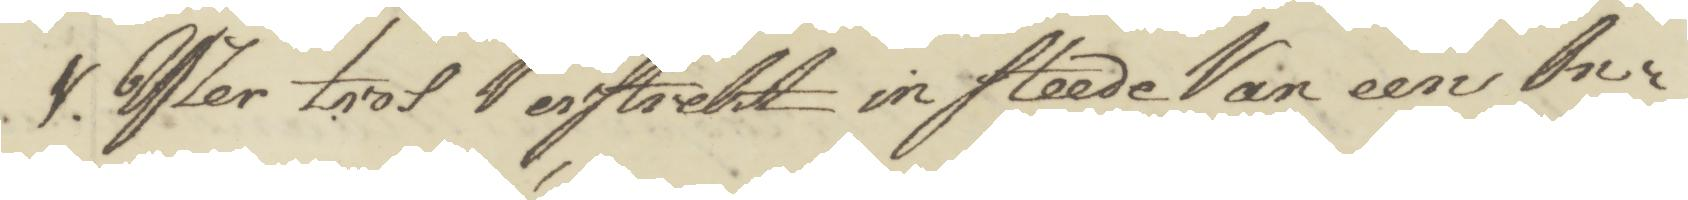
4. Yzer tros Verstrekt in steede Van een On
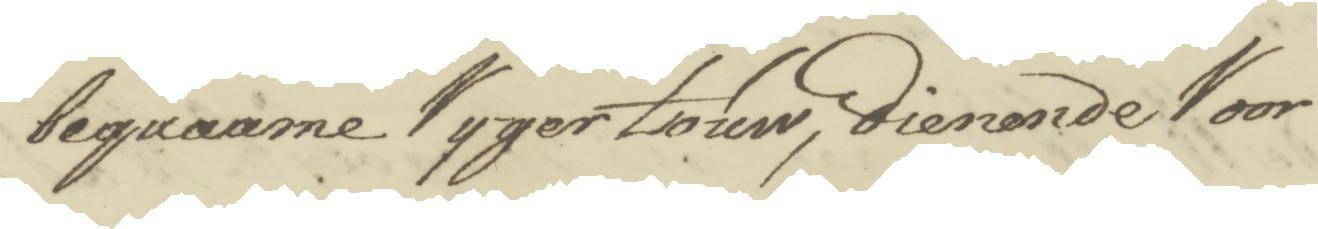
bequaame Vygertouw, dienende Voor
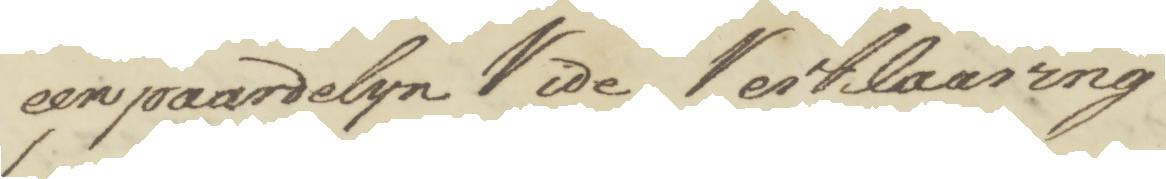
een paardelyn Vide Verklaaring
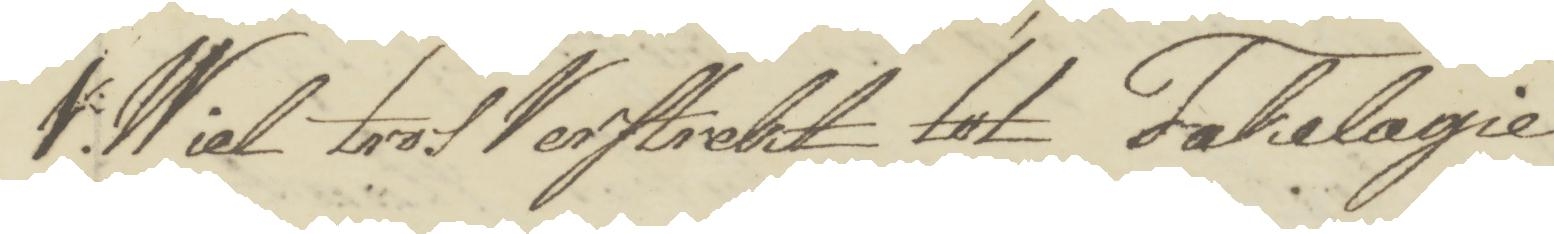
1. Wiel tros Verstrekt tot Takelagie
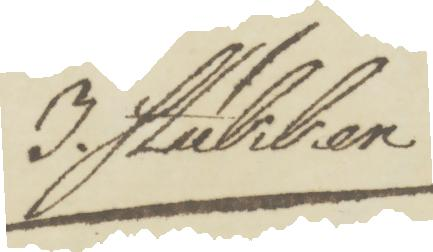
3. stukken
